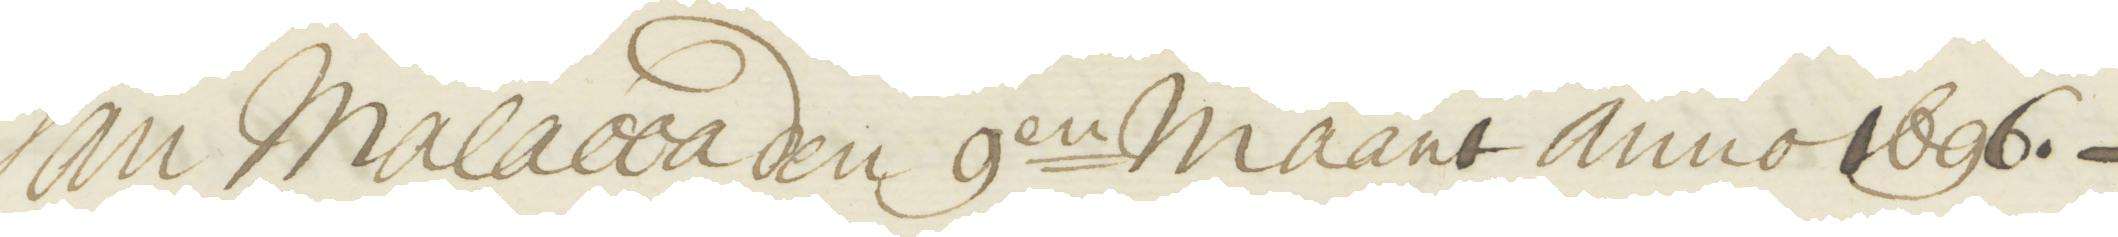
Van Malacca den 9=en Maart Anno 1696. —
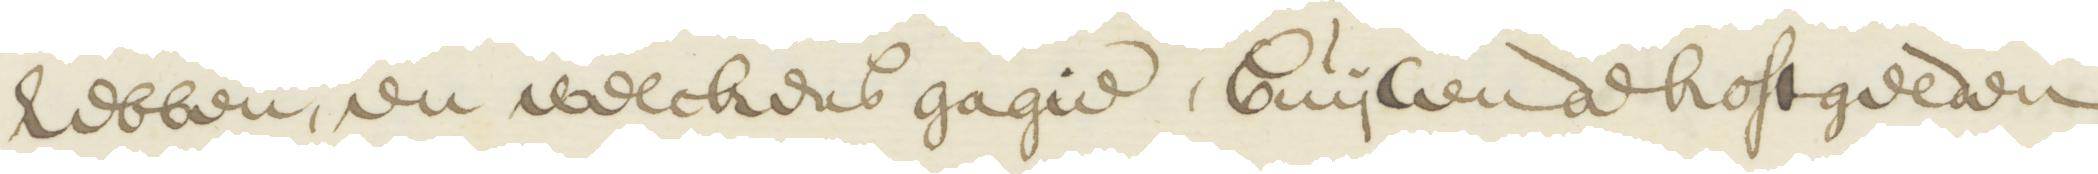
hebben, en welckers gagie, buijten de kostgelden,
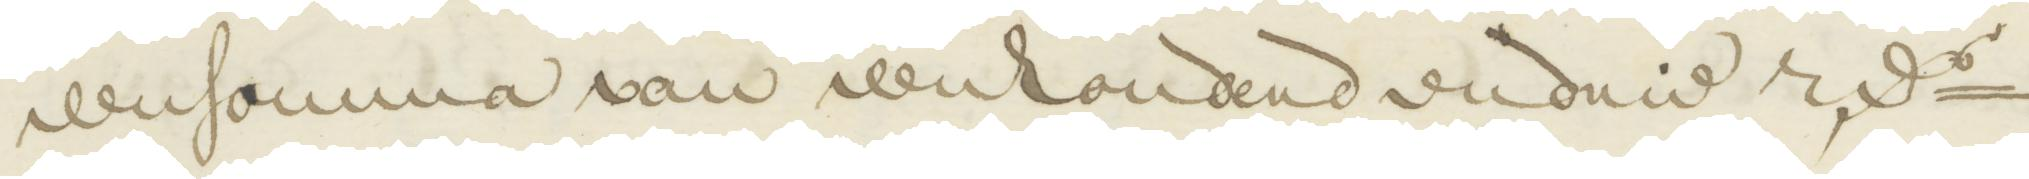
een somma van een honderd en drie rd=s
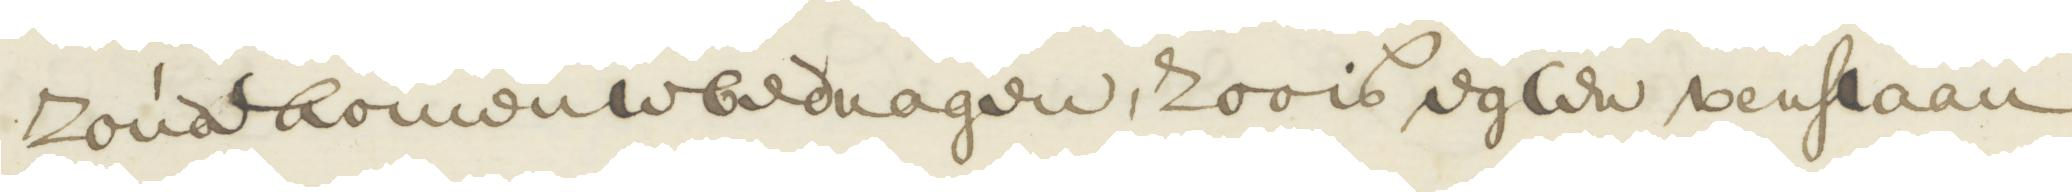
zoude komen te bedragen, zoo is egter verstaan
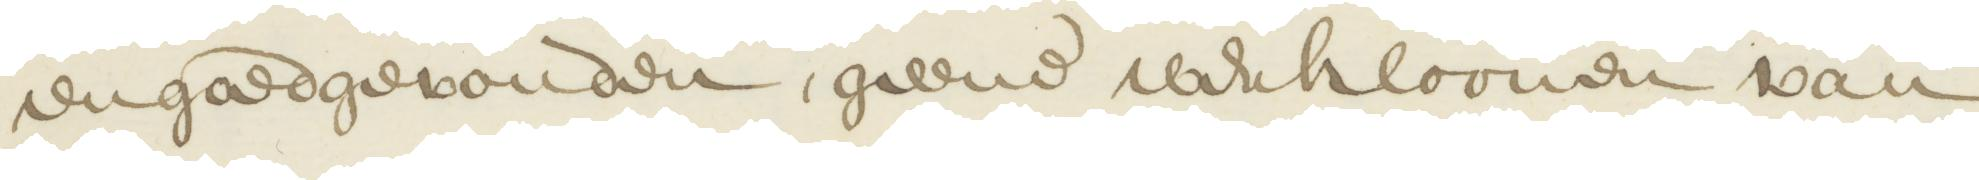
en goedgevonden, geene werkloonen van
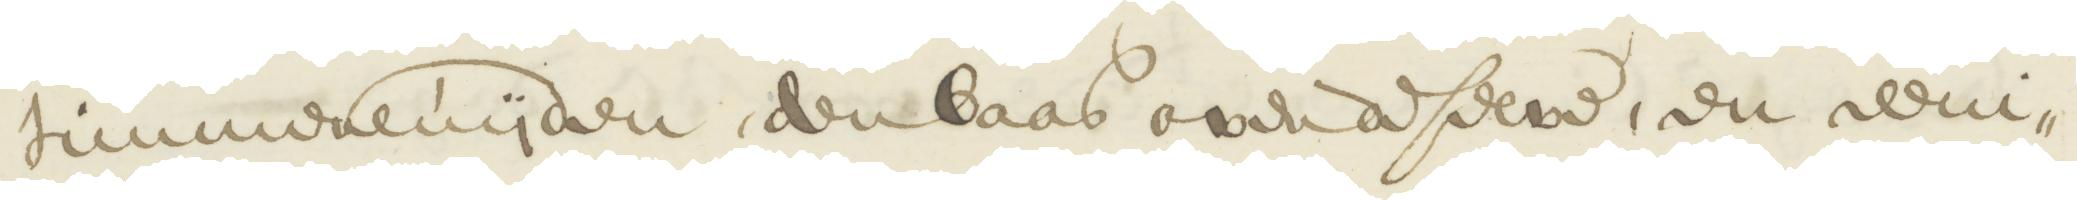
timmerluijden, den baas over deselve, en eeni„
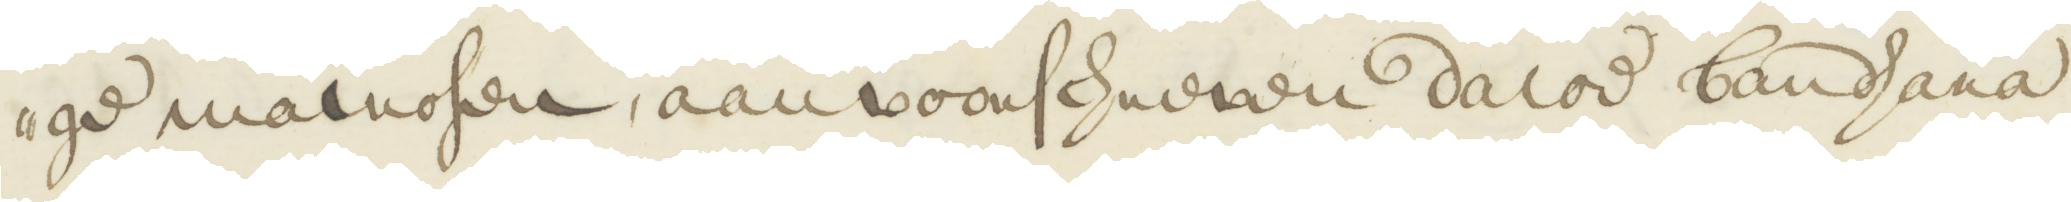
„ge matrosen, aan voorschreven datoe bandhara
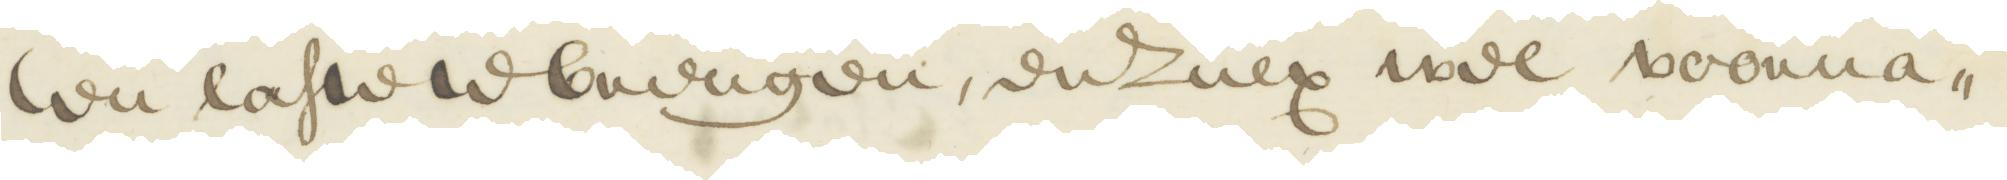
ten laste te brengen, en zulx wel voorna„
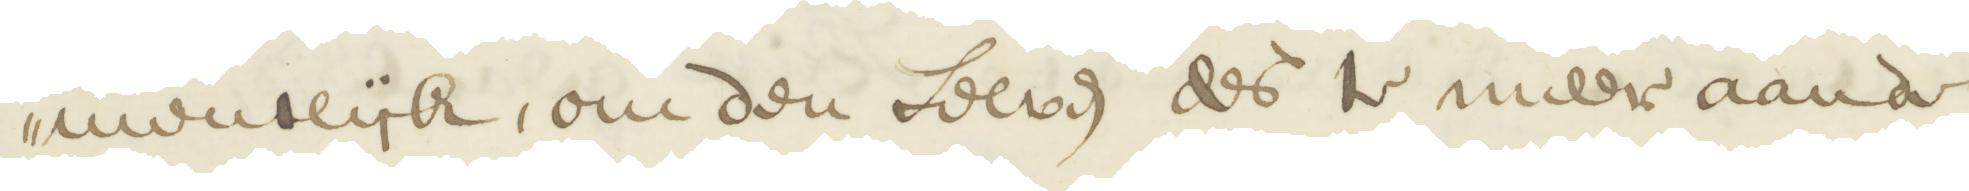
„mentlijk, om den selven des te meer aan de
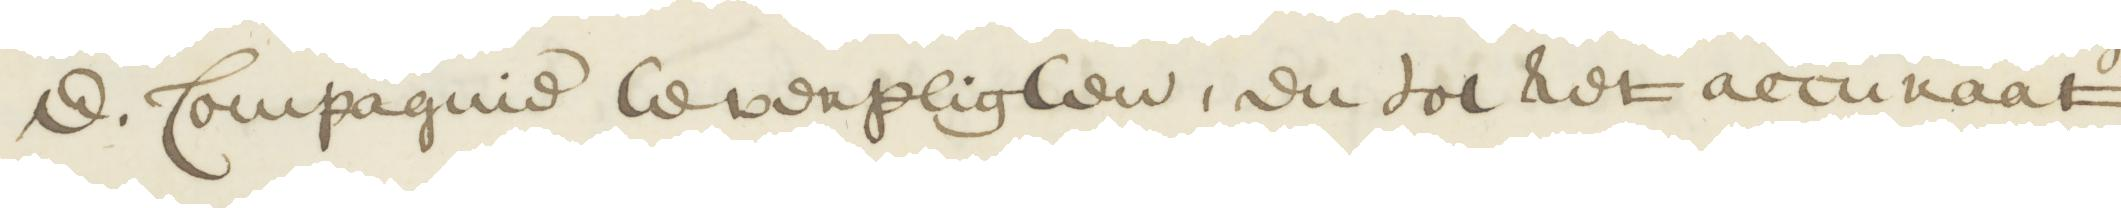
E. Compagnie te verpligten, en tot het accuraat
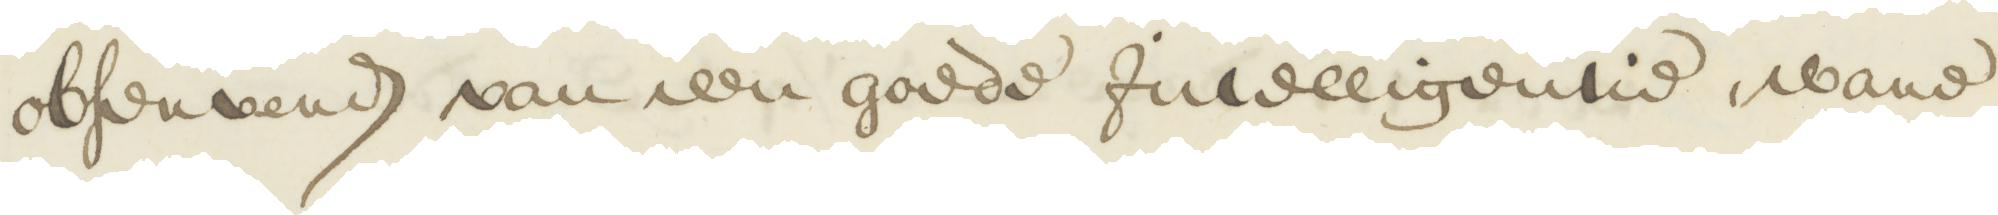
observeren van een goede Intelligentie, ware
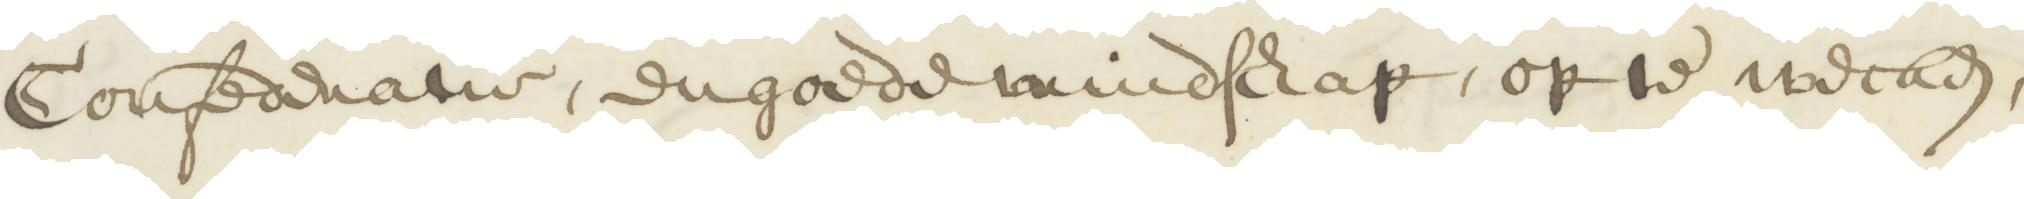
Consederatie, en goede vrindschap, op te wecken,
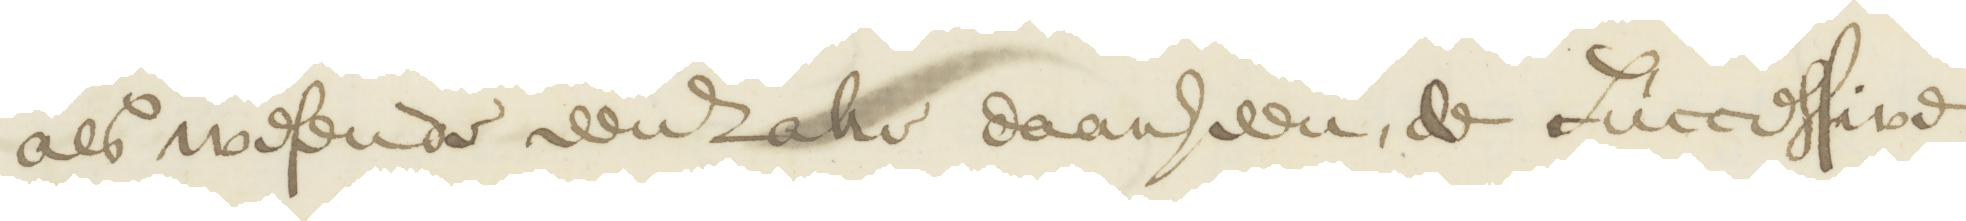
als wesende een zake daarheen, de successive
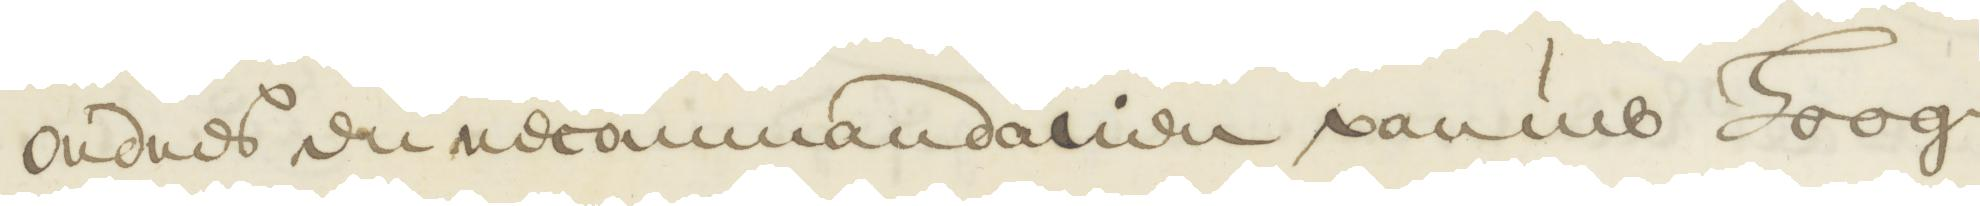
ordres en recommandatien van uw hoog
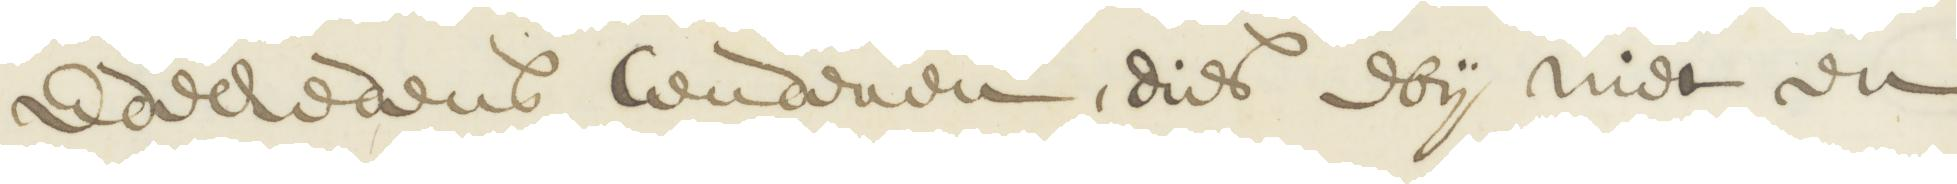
Edelhedens tenderen, dies wij niet en
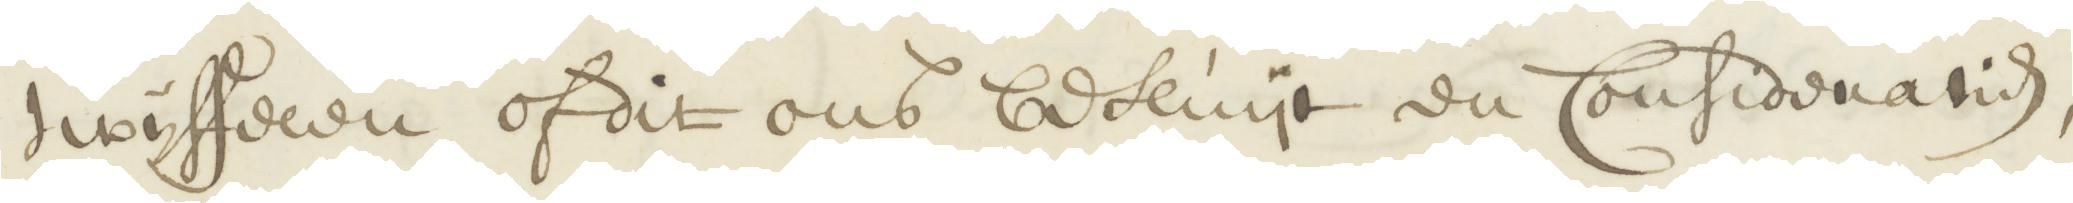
twijffelen of dit ons besluijt en Consideratien,
